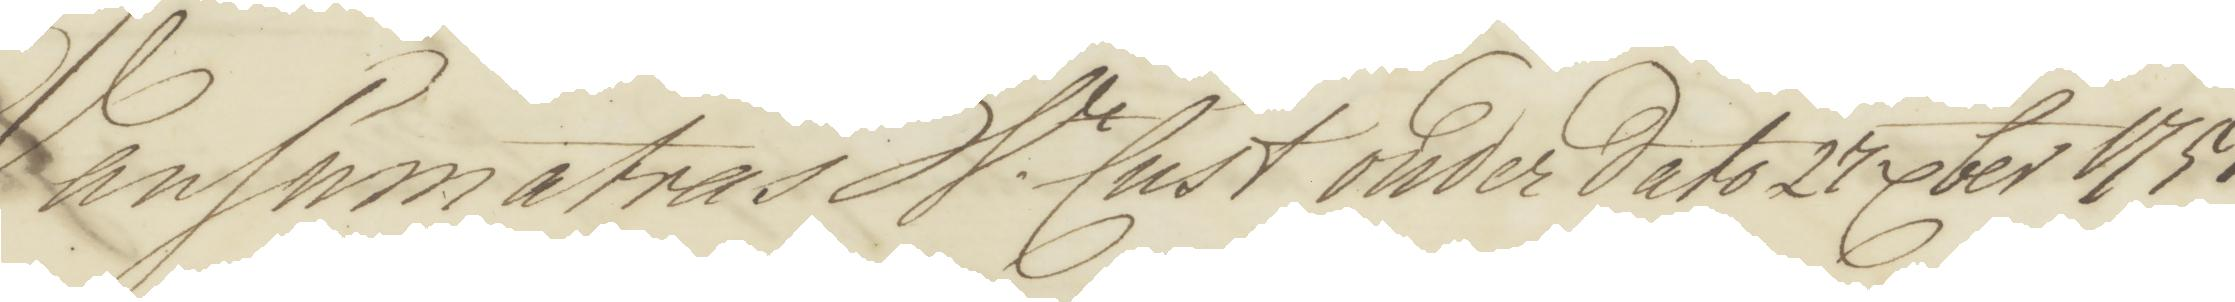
Van Sumatras W„t Cust onder dato 27 xber 1751
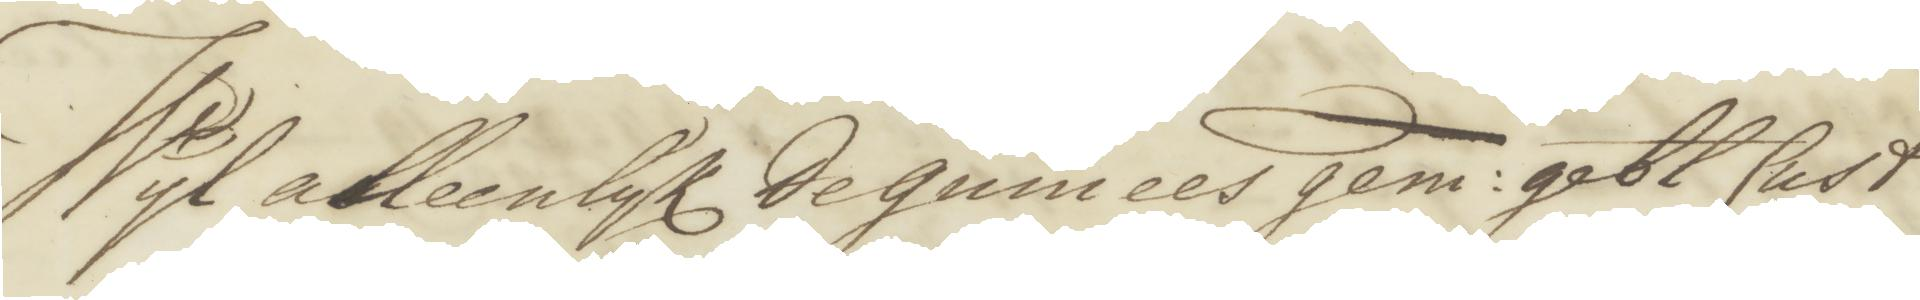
Wijl alleenlijk de guinees gem: gebl Cust
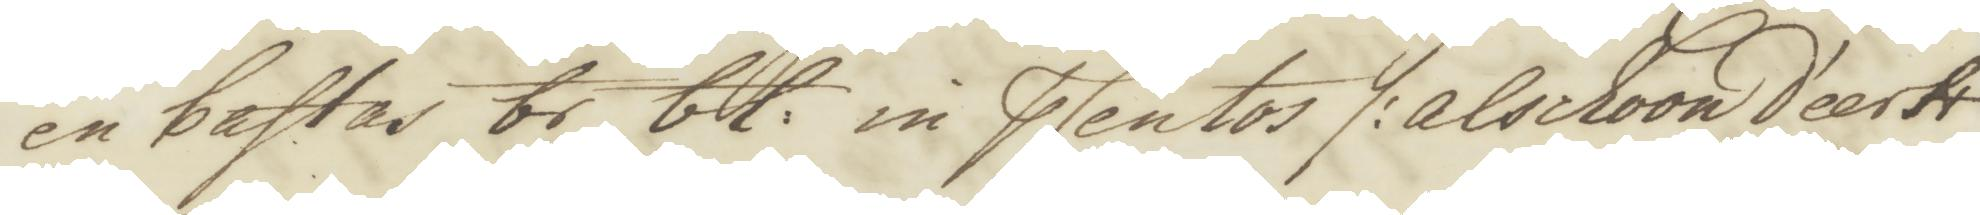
en bastas br bl: in pCentos /: alschoon d’eerst
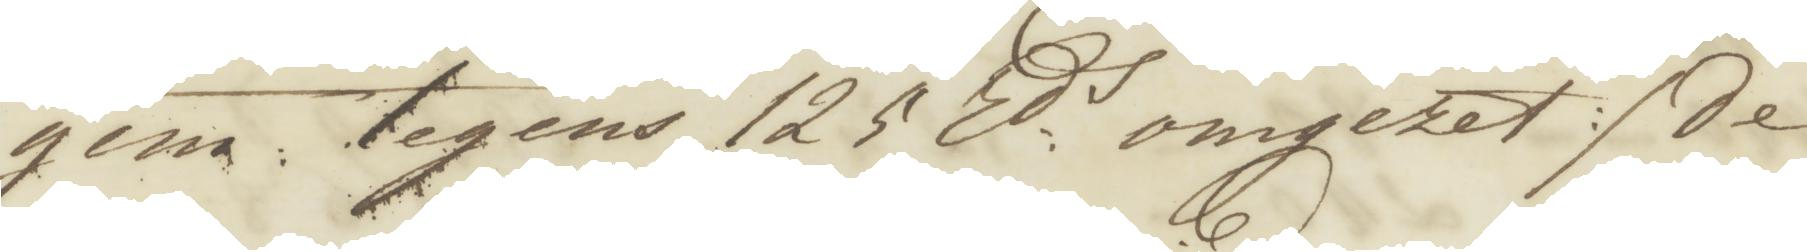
gem tegens 125 rd:s omgezet :/ de
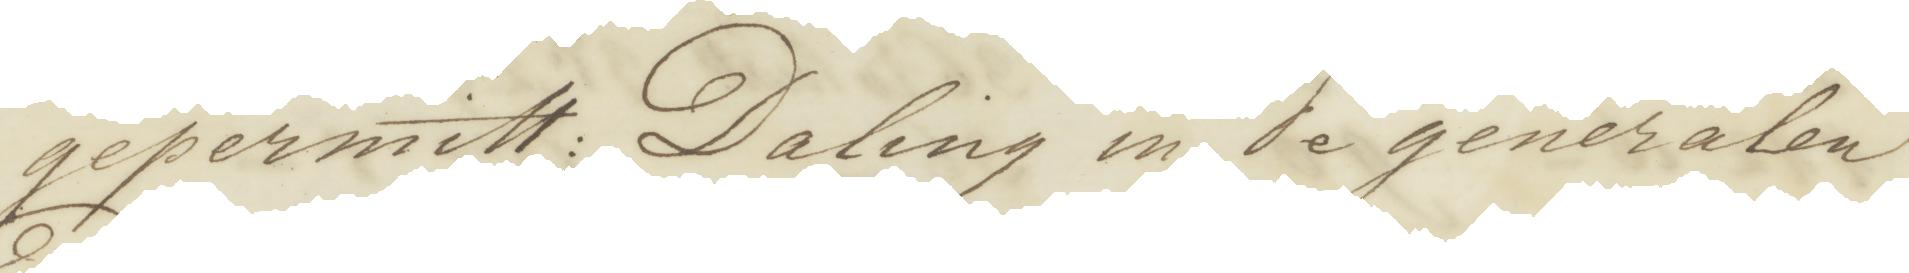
gepermitt: Daling in de generalen
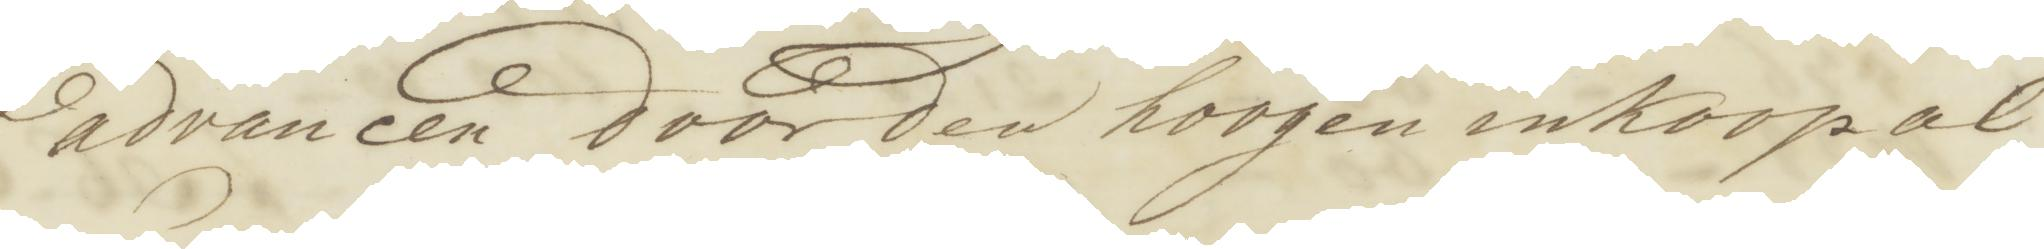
advancen door den hoogen inkoop al
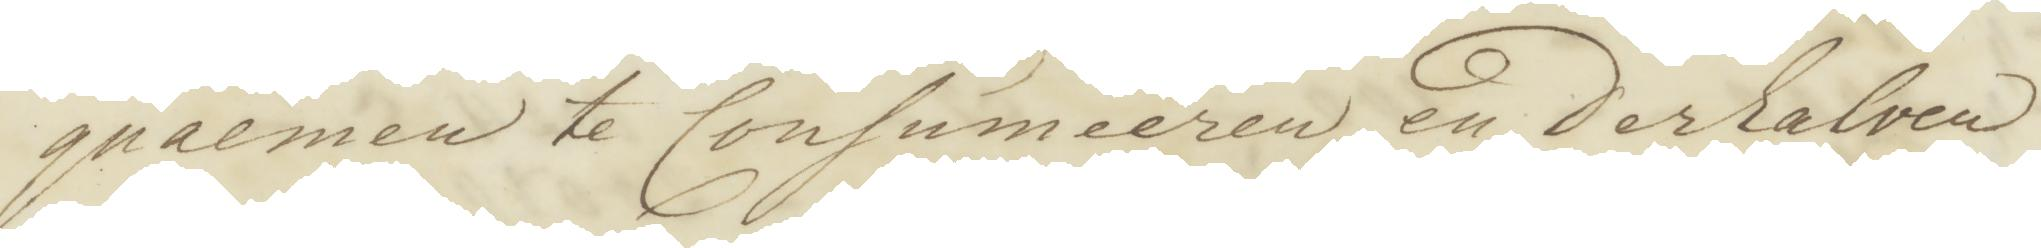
quaemen te Consumeeren en derhalven
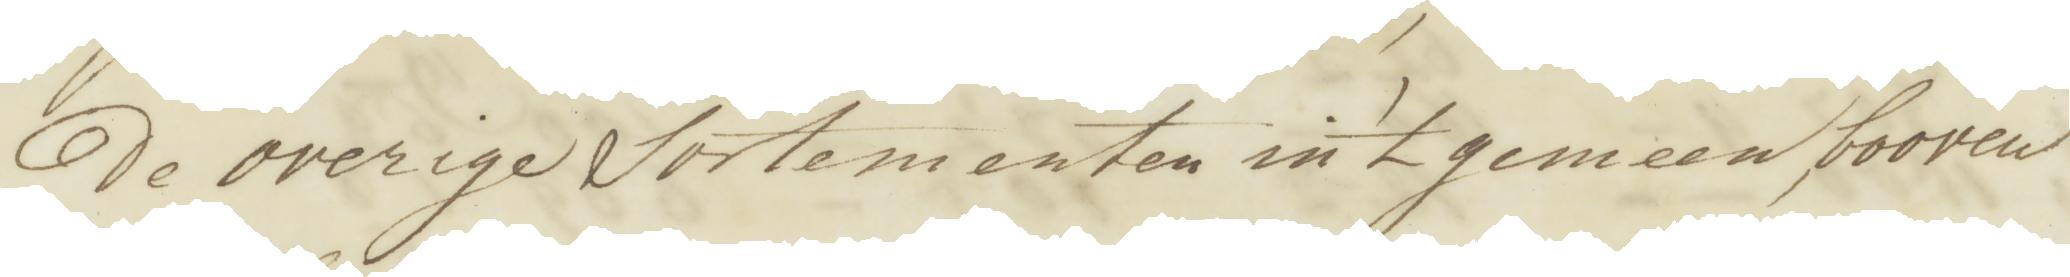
de overige sortementen in ’t gemeen, booven
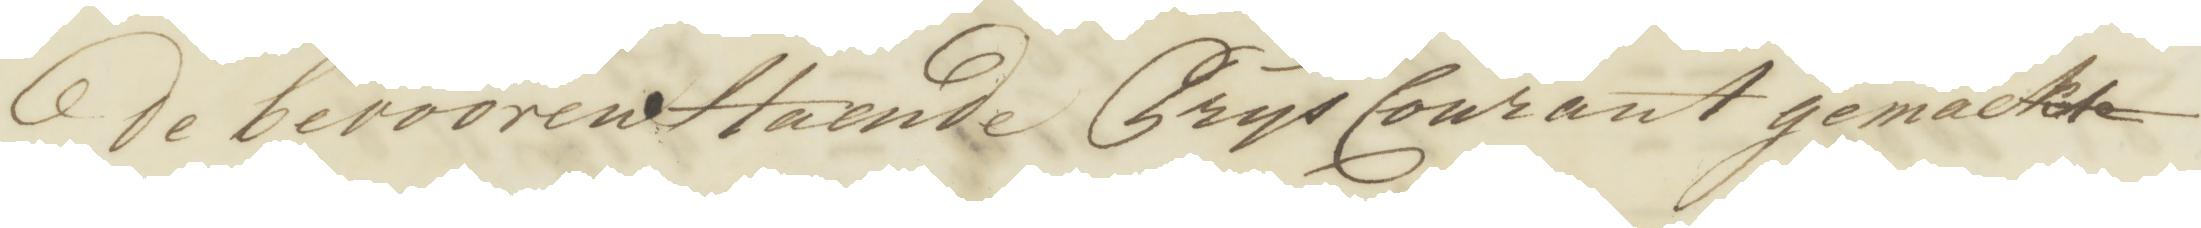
de bevoorenstaende Prijs Courant gemaekte
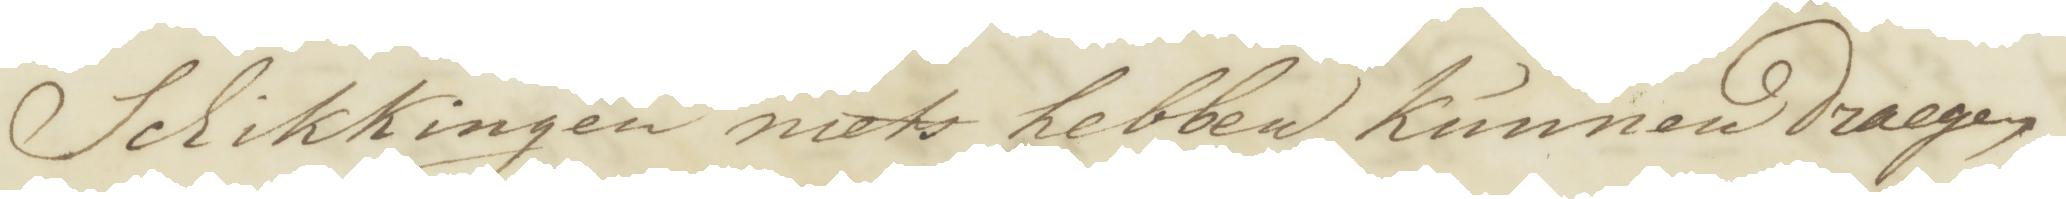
schikkingen niets hebben kunnen draegen
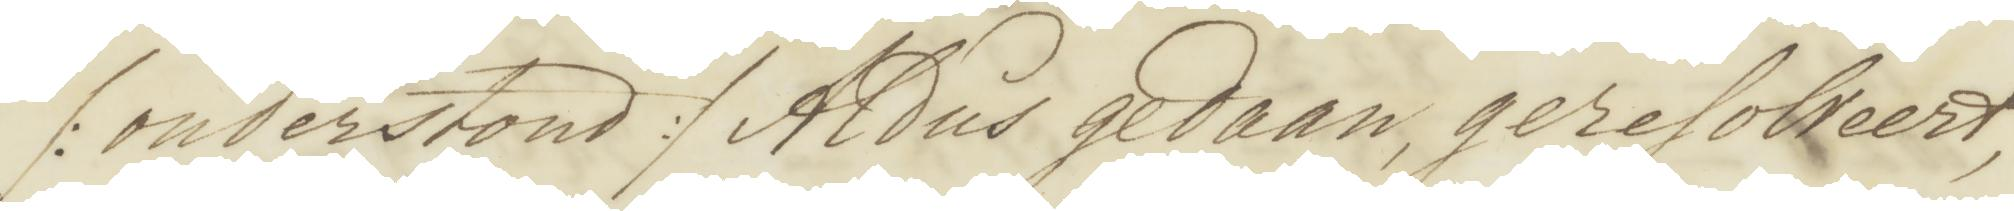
/: onderstond :/ Aldus gedaan, geresolveert,
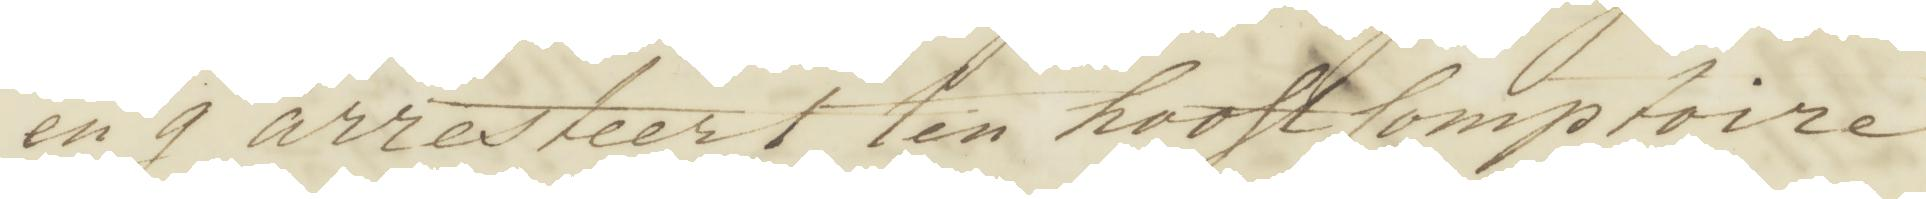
en g’arresteert ten hooft Comptoire
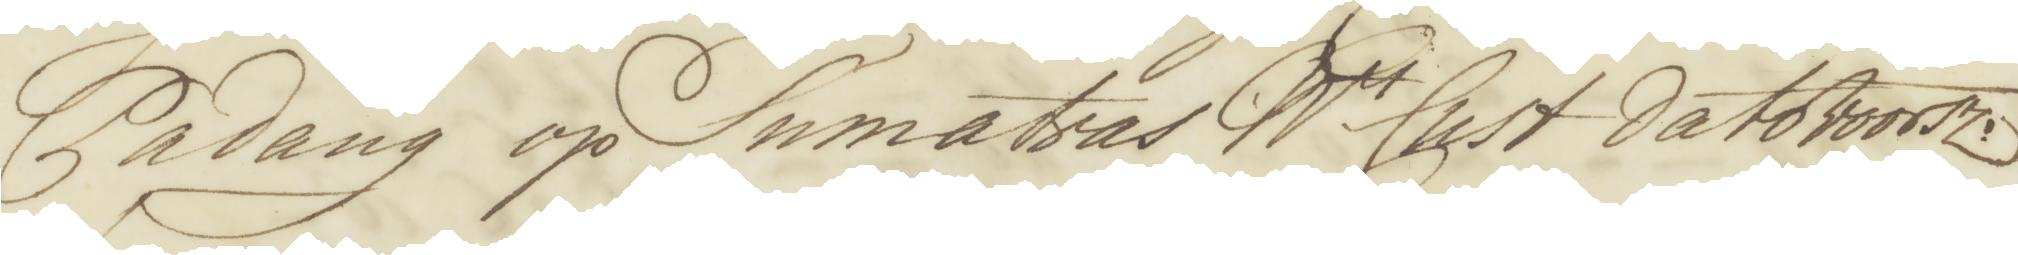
Padang op Sumatras Wt Cust dato voorsz:
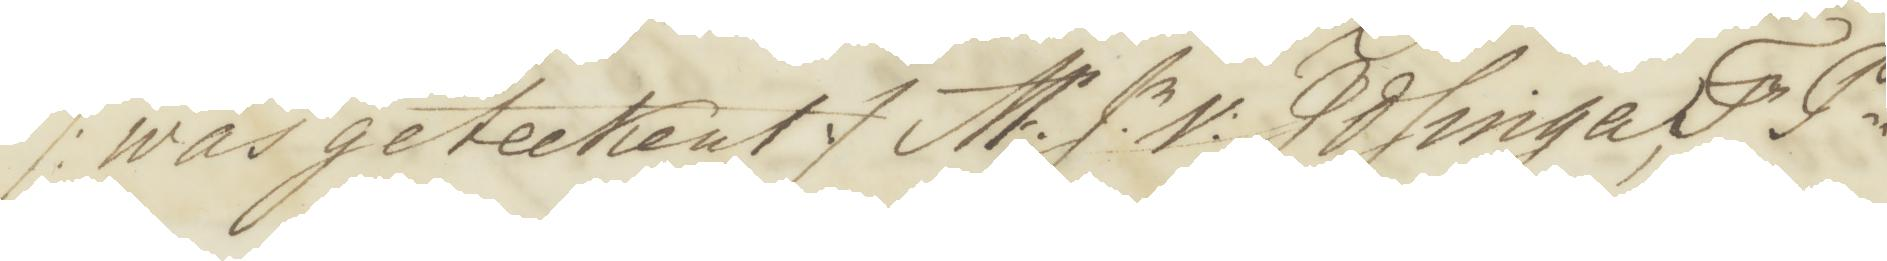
/: was geteekent :/ M„t J.n v: Jasinga, F P„r
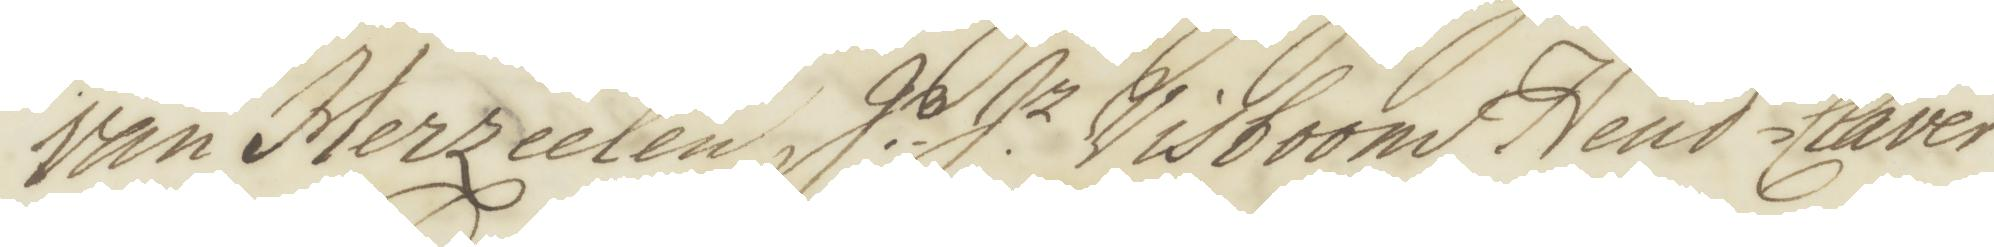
van Herzeelen, J.n J.z Visboom, Hend-k Claver
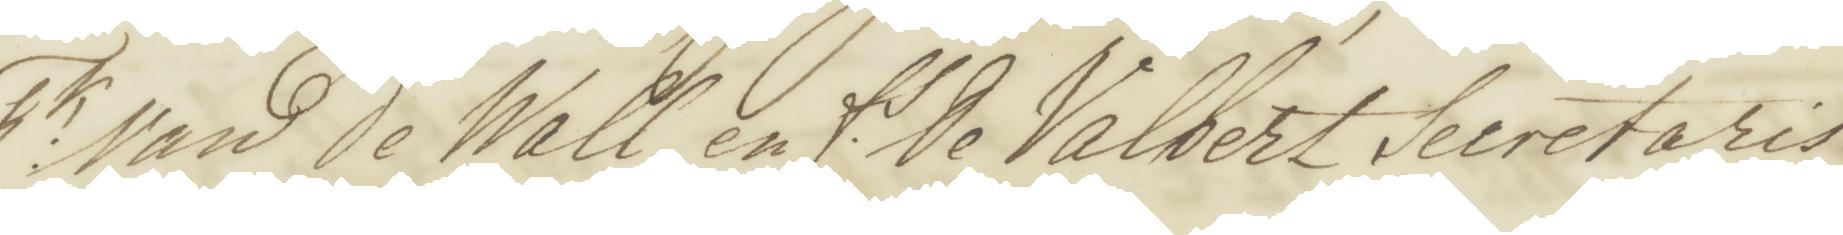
F:k van de Wall, en f.s de Valbert secretaris
